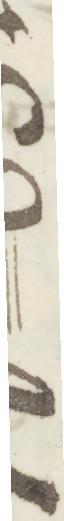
N=o 85.
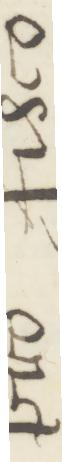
pro fisco
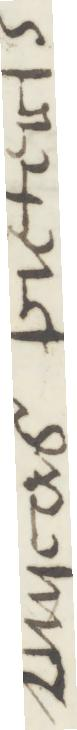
Luijcas pieters
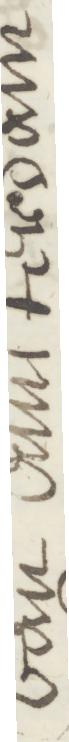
van amsterdam
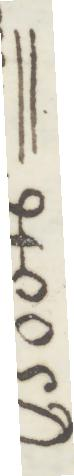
Boots=m
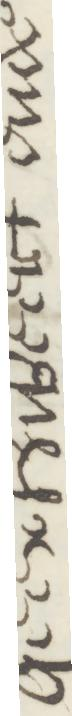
geexhibeert ende
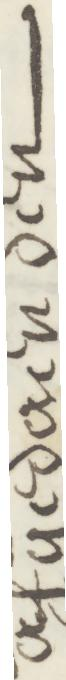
afgedaen den
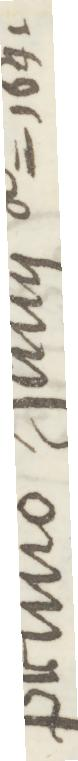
primo Junij a=o 1641
